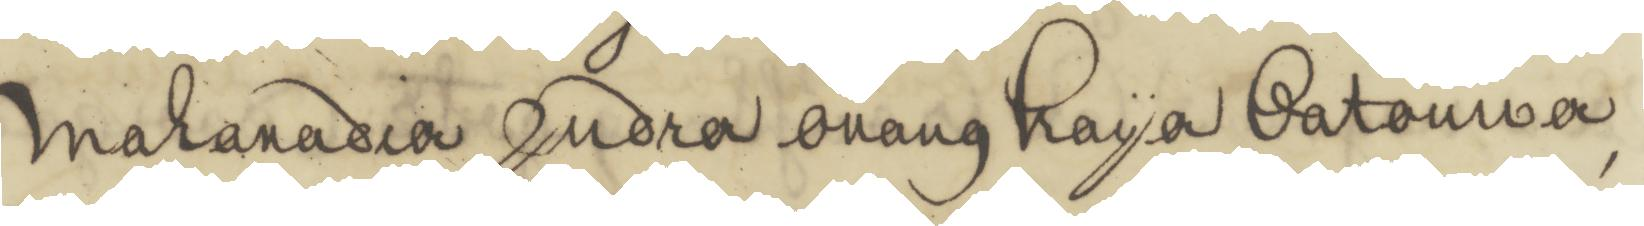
maharadia Jndra orang kaija batouwa,
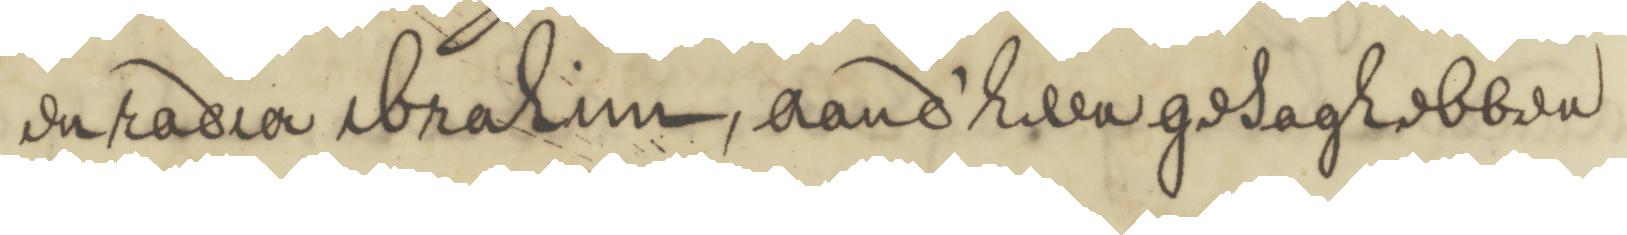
en radia ibrahim, aan d’ heer gesaghebber
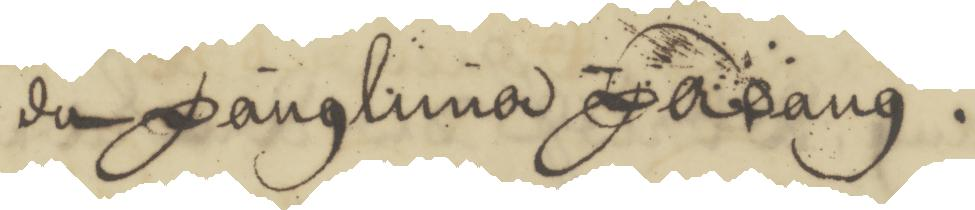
en panglima padang.
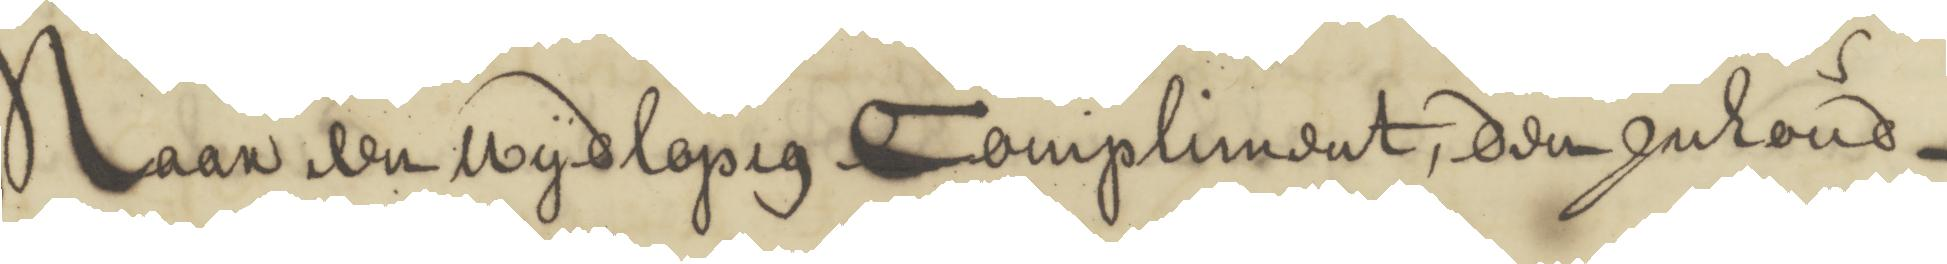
Naar een wijdlopig compliment, den inhoud
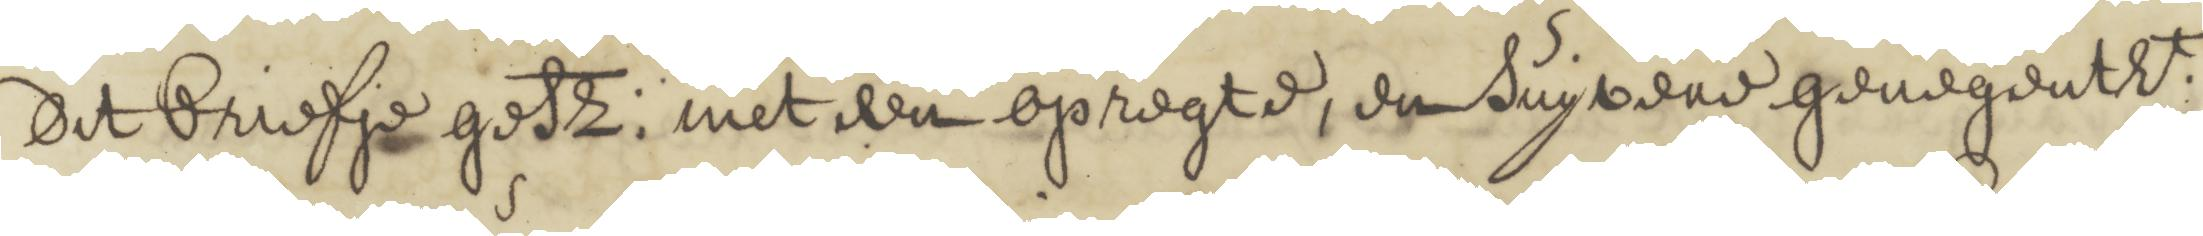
dit briefje gesz: met een opregte, en suyvere genegentht:
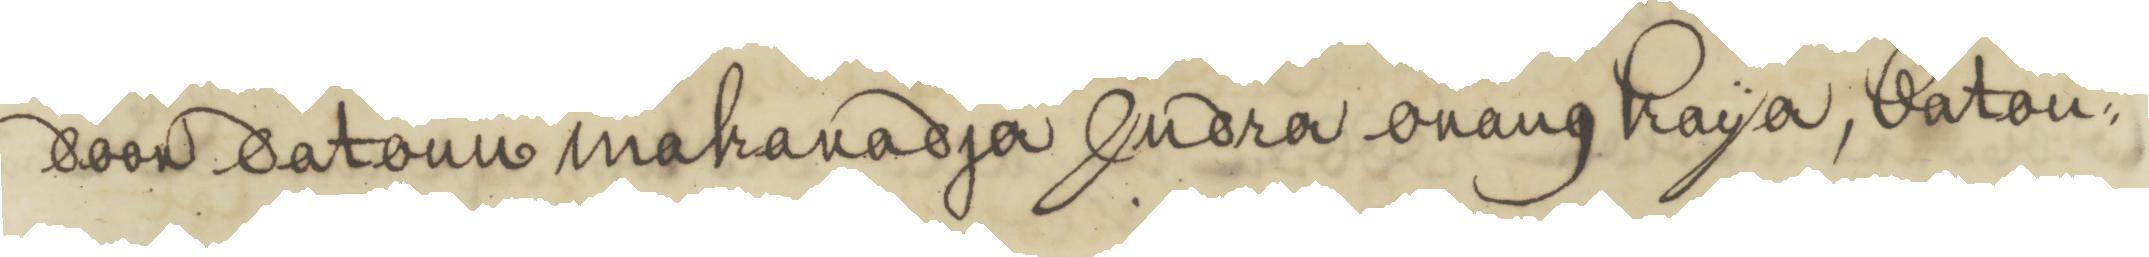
door datouw makaradja Jndra orang kaija, batou„
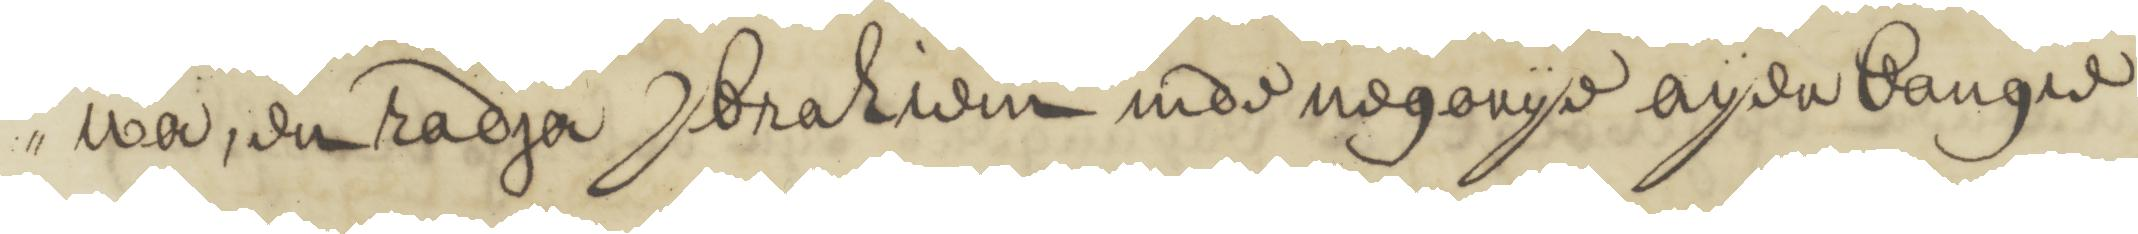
„wa, en radja Jbrahiem inde negorije aijen bangie
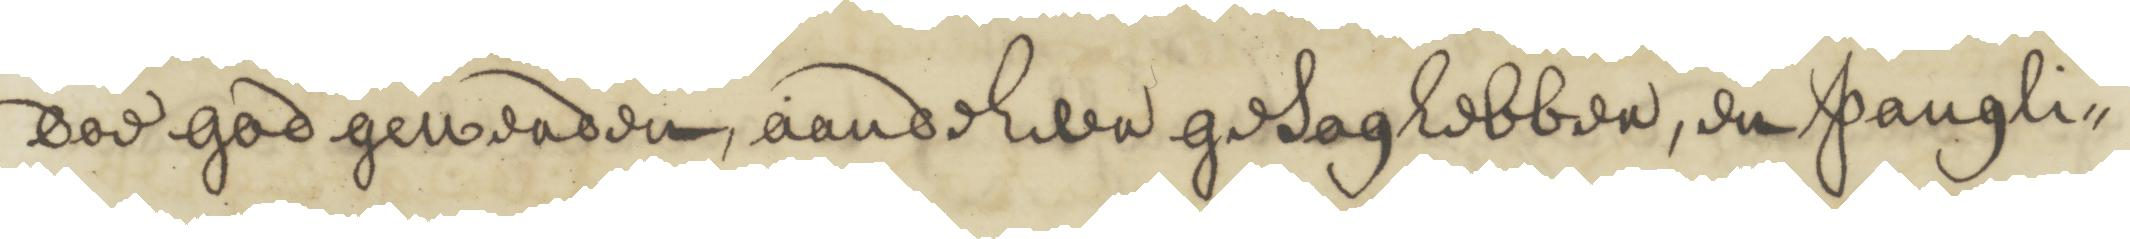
doe god gewerden, aande heer gesaghebber, en Pangli„
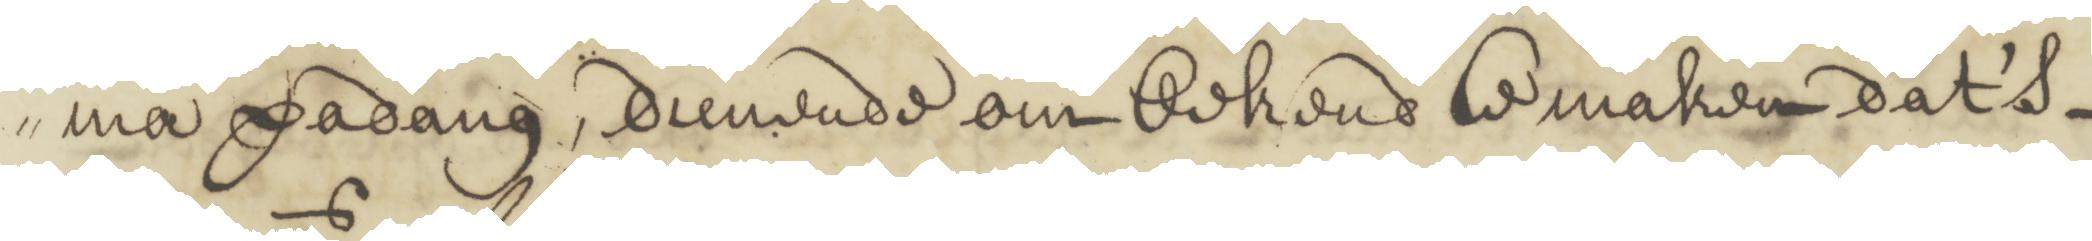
ma padang, dienende om bekend te maken dat ’s
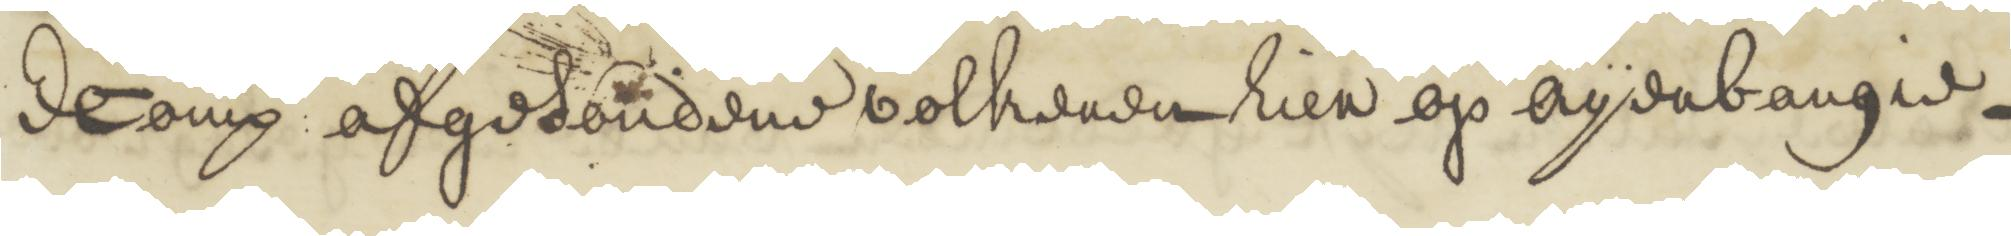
Ecomp:s afgesondene volkeren hier op aijenbangie
